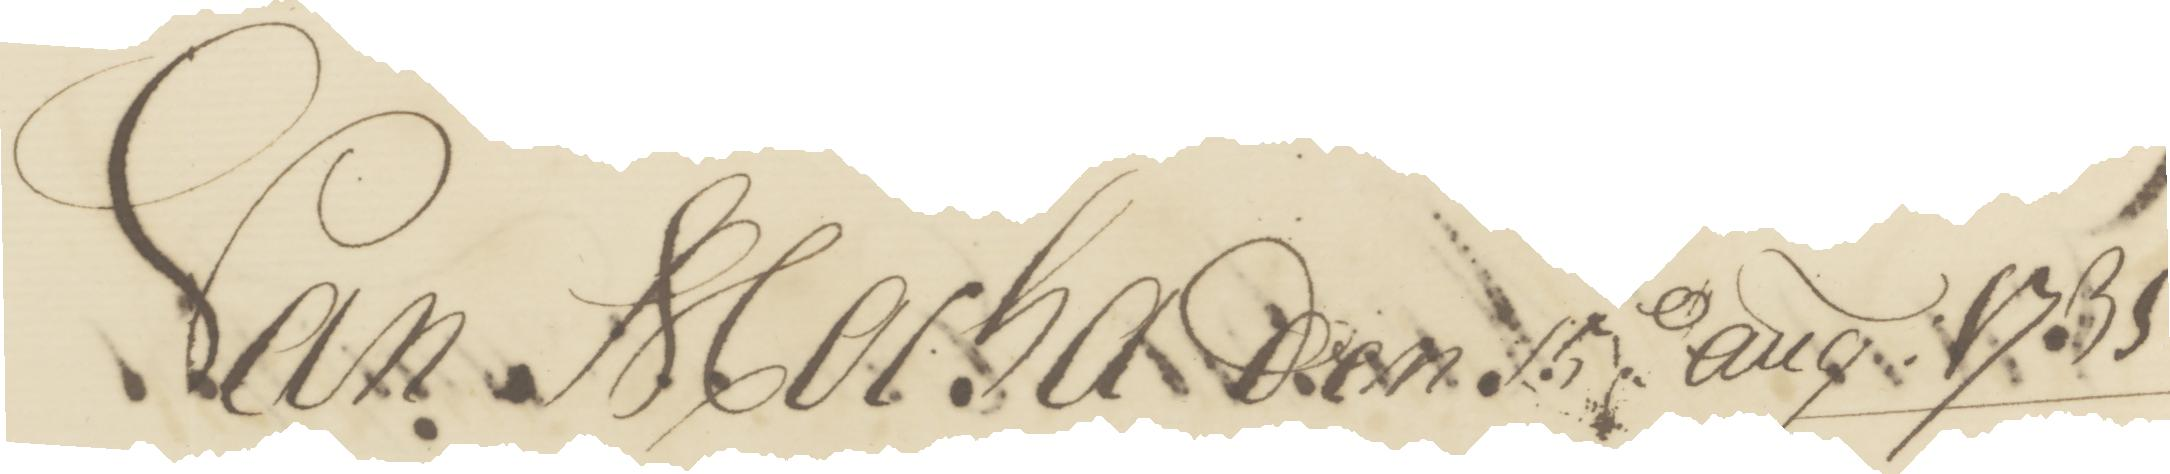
Van Mocha den 15:e aug: 1735
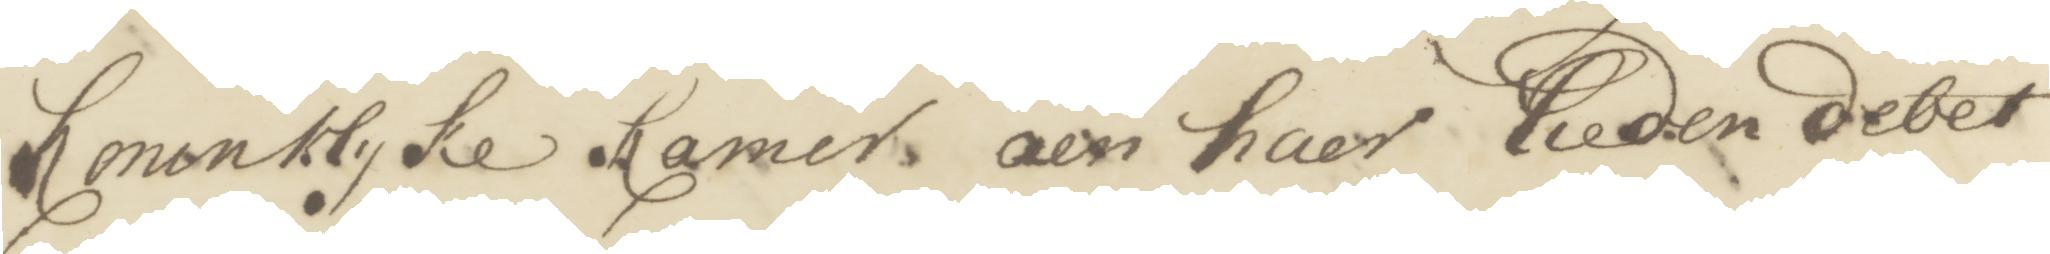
koninklyke kamer aen haer lieden debet
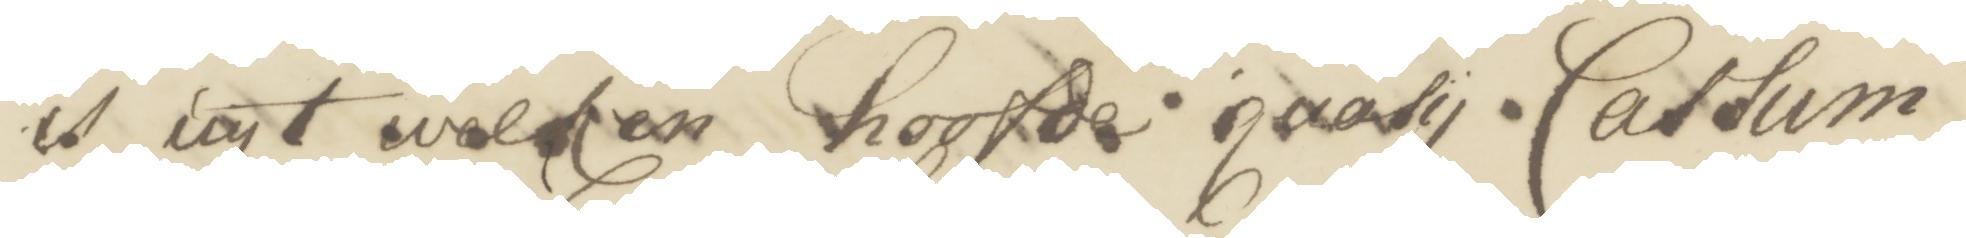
is uyt welken hoofde quasij Cassum
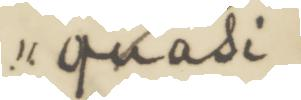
„quasi
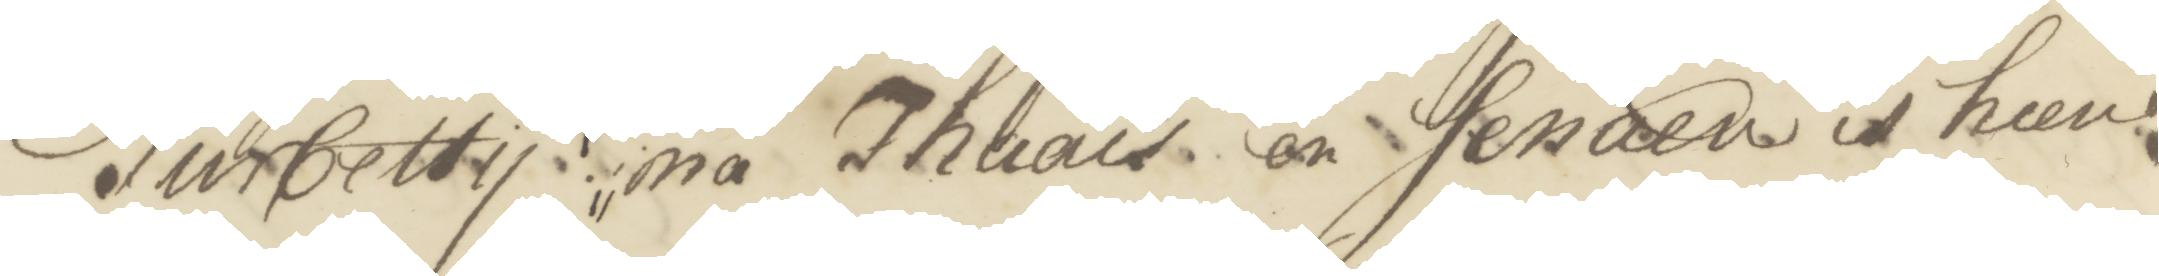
Turbettij „ na Thaais en senaen is heen
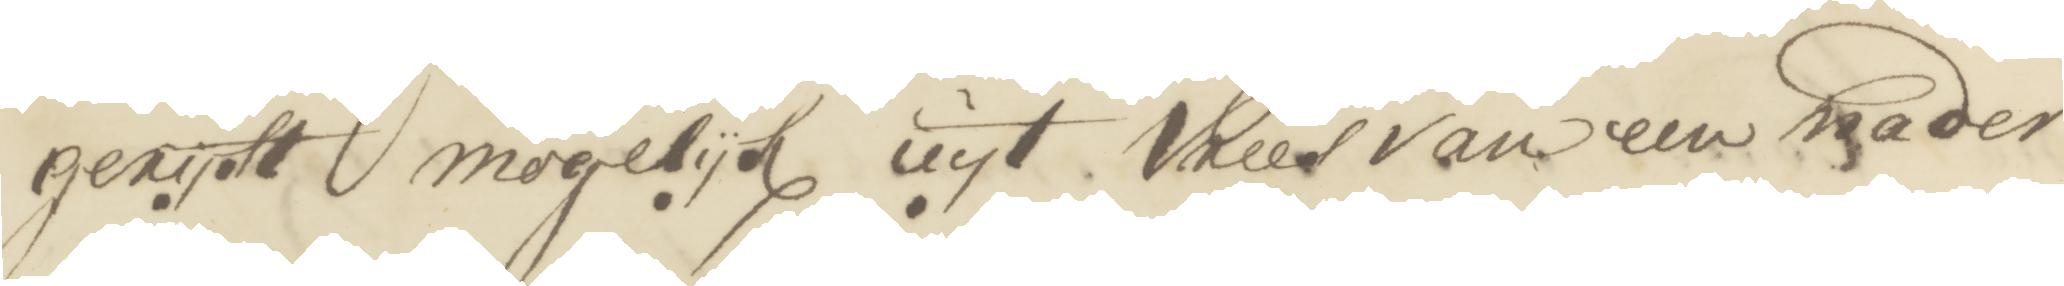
gerijst mogelijk uyt vrees van een nader
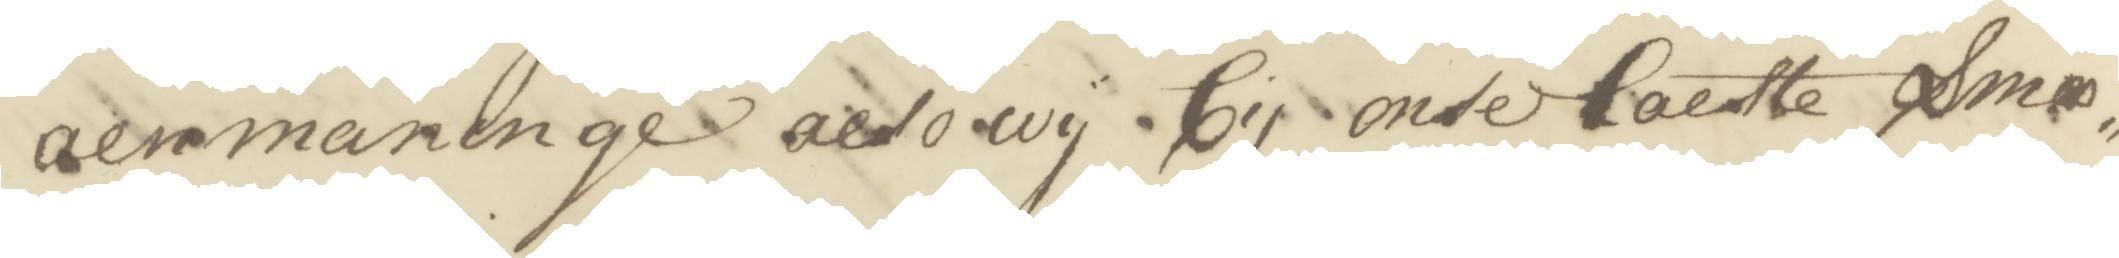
aenmaninge also wij bij onse laeste verma„
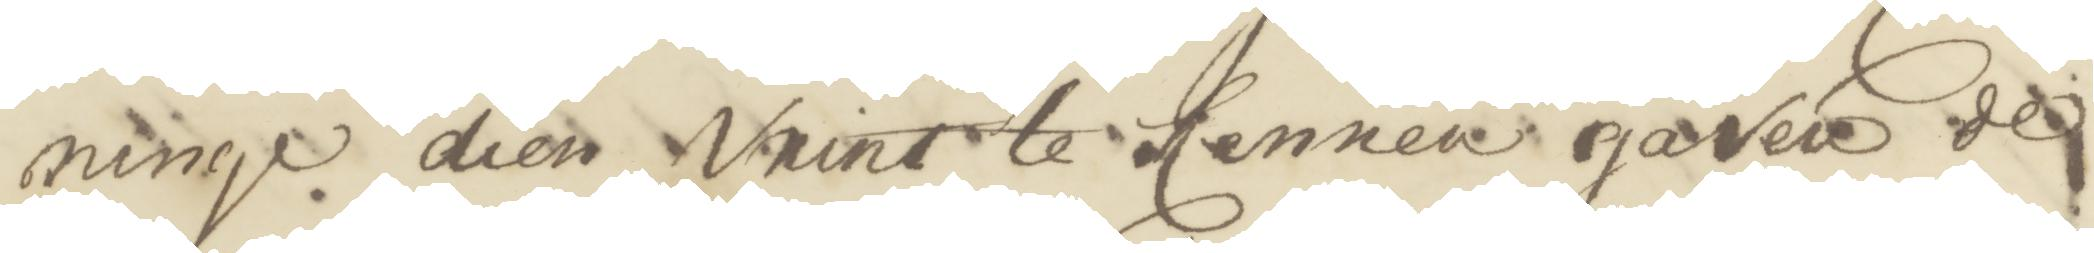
ninge dien vrint te kennen gaven de
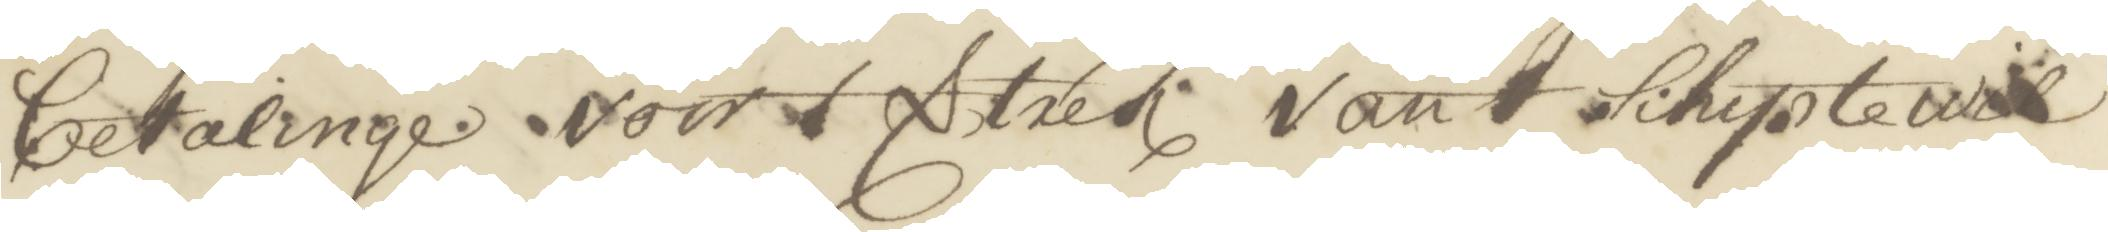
betalinge voor t vertrek van t schip te wil
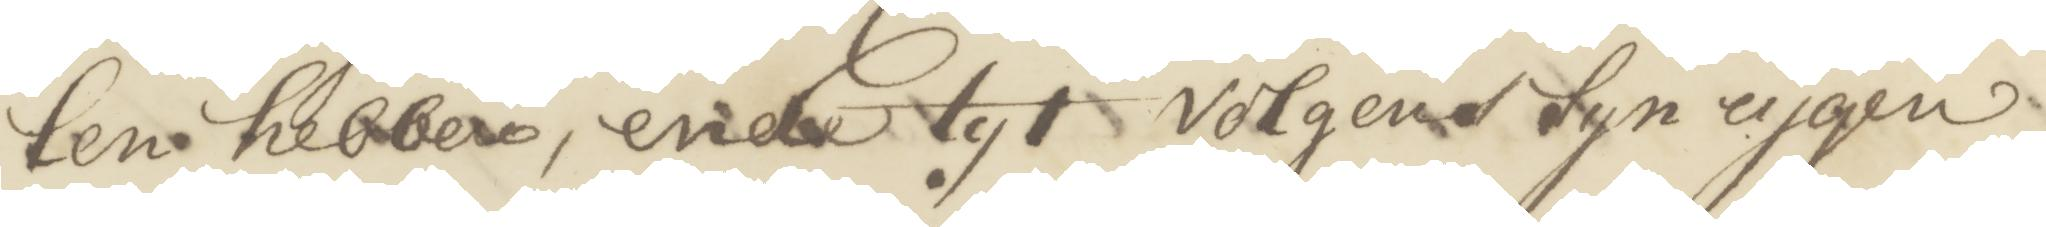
len hebben, ende tyt volgens syn eygen
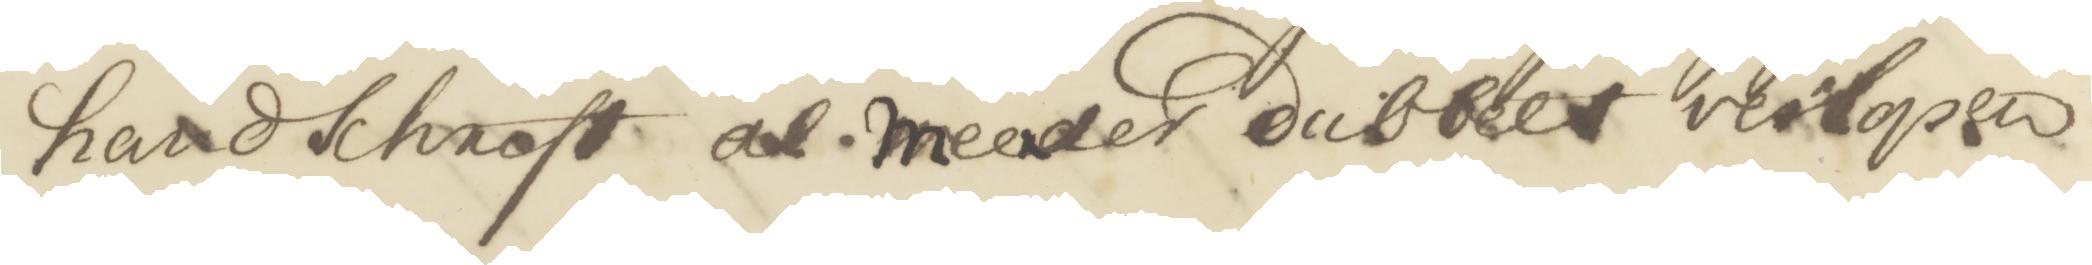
handschrift al meerder dubbelt verlopen
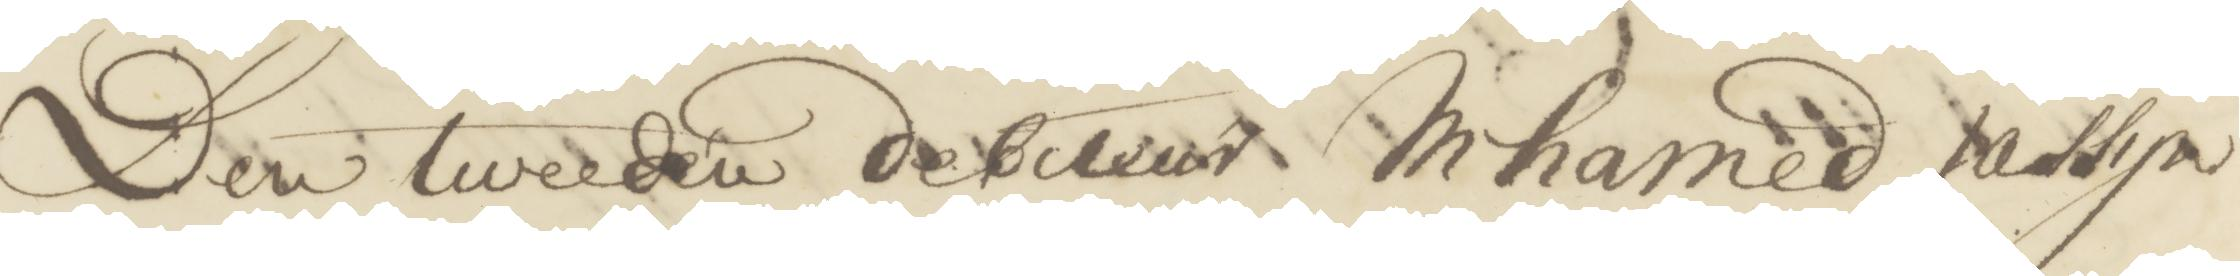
Den tweeden debiteur Mhamed jassyn
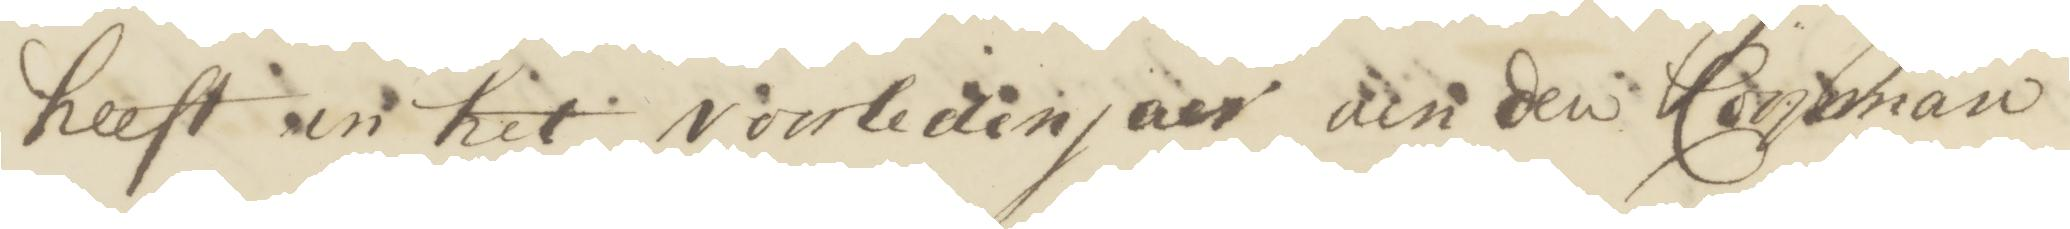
heeft in het voorleden jaer aen den Coopman
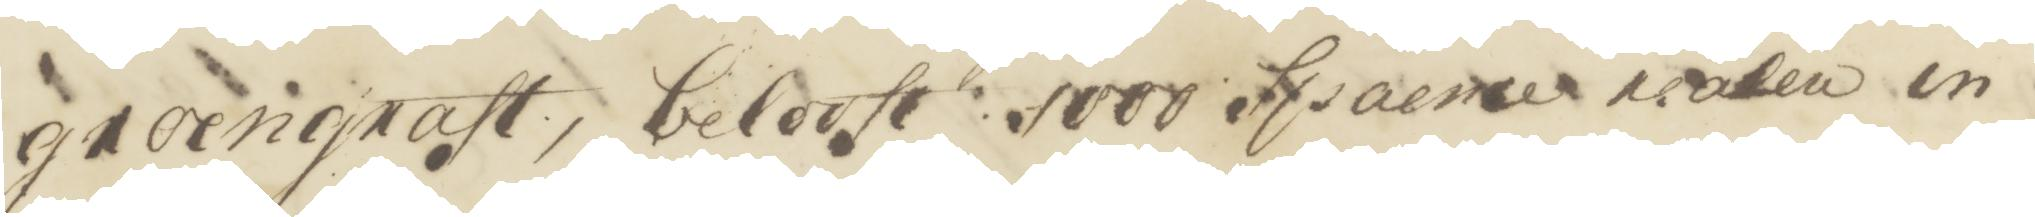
groengrast, belooft 1000 spaence realen in
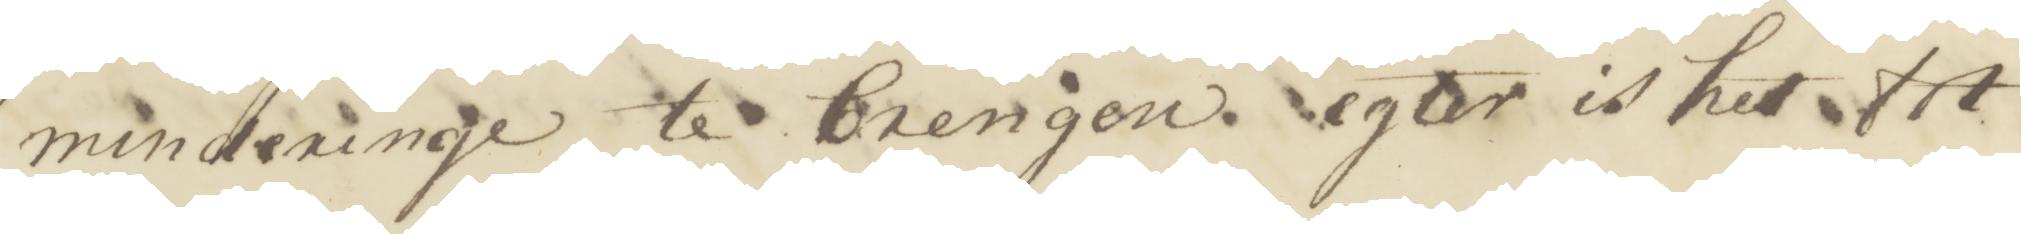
minderinge te brengen egter is het tot
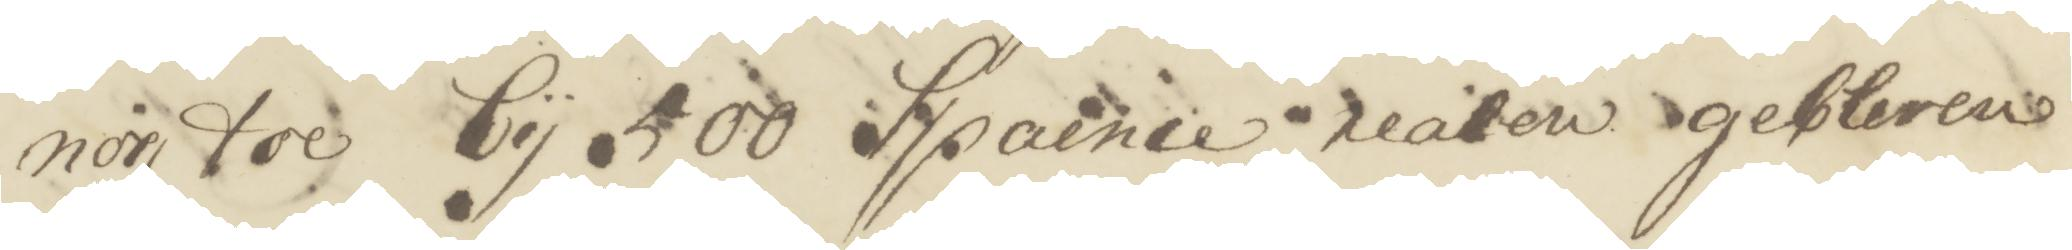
nog toe bij 500 spaence realen gebleven
